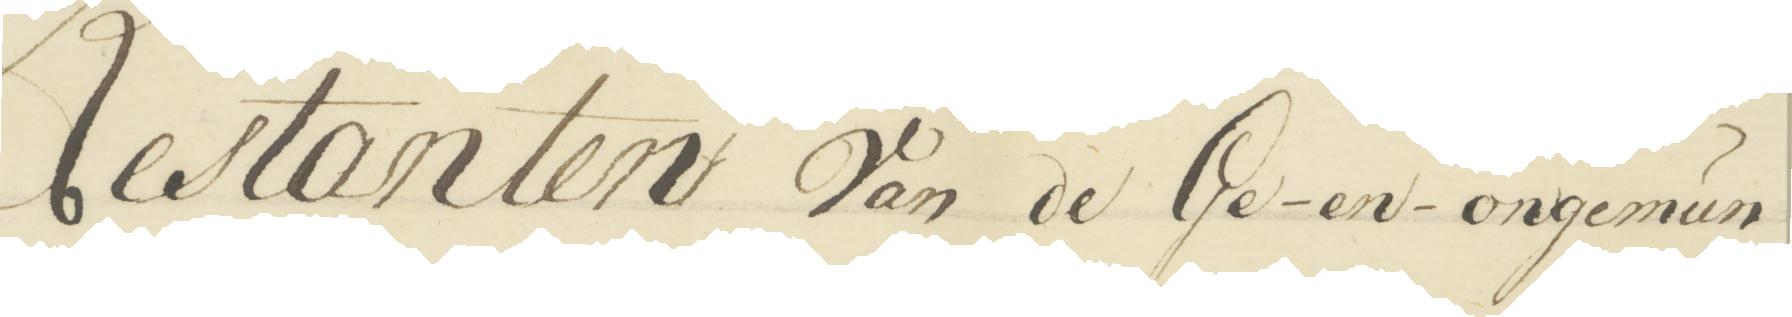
Restanten van de Ge-en-ongemun
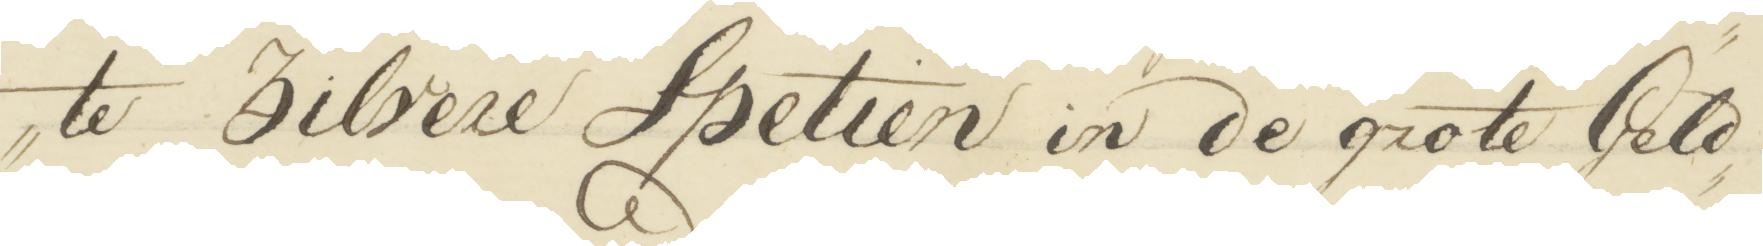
„te Zilvere Spetien in de grote Geld„
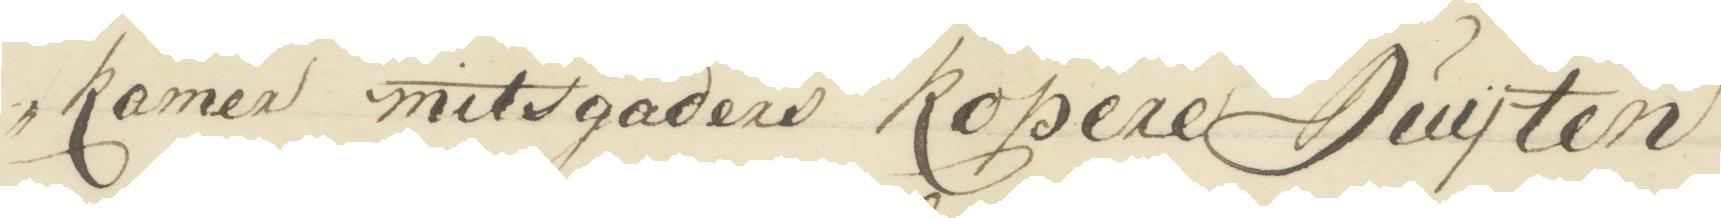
„kamer mitsgaders kopere Duijten
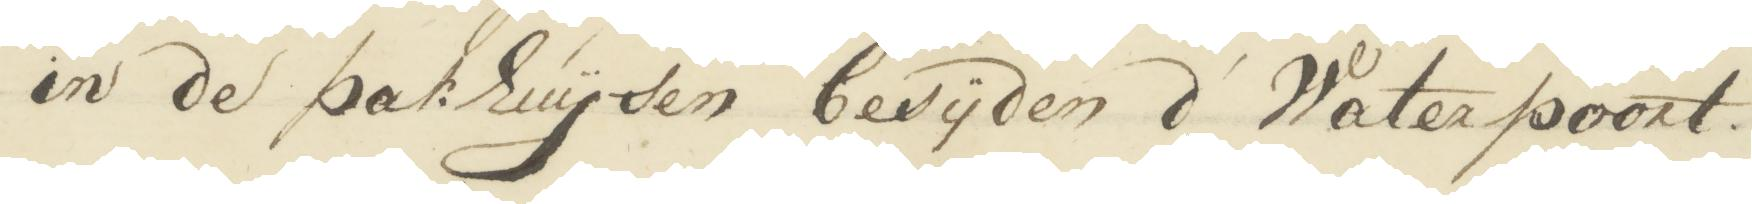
in de pakhuijsen besijden d’ Waterpoort.
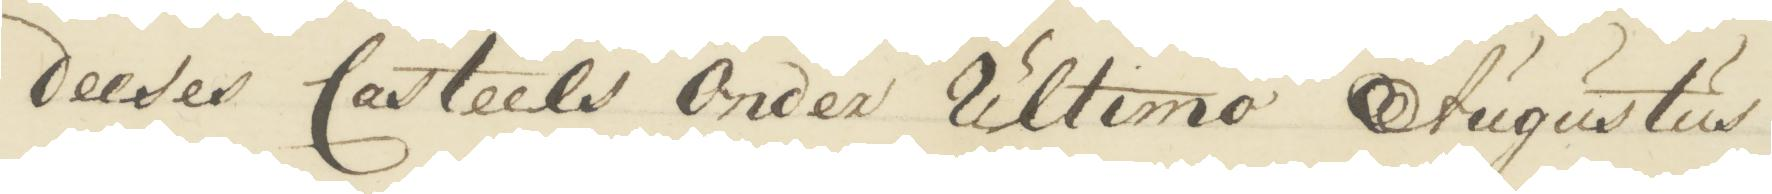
deeses Casteels onder ultimo Augustus
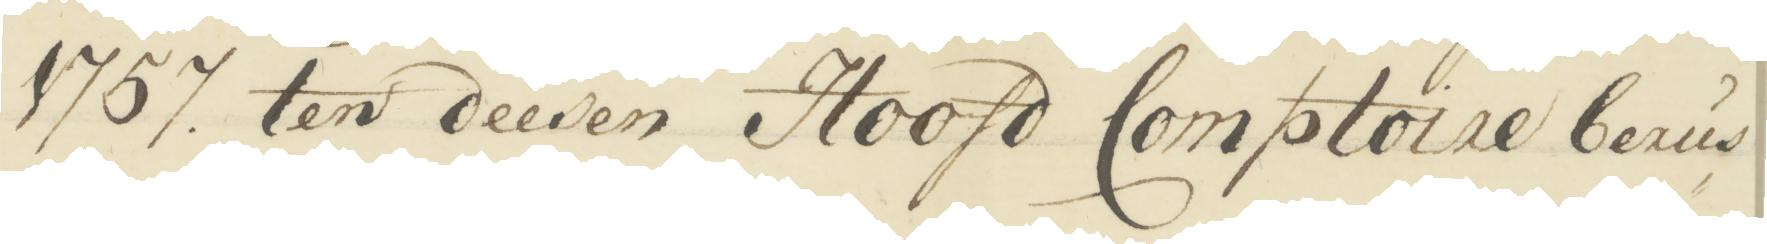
1757. ten deesen Hoofd Comptoire berus„
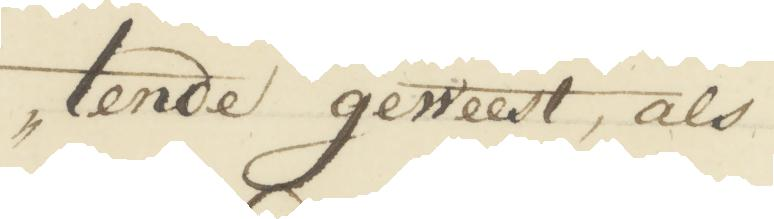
„tende geweest, als
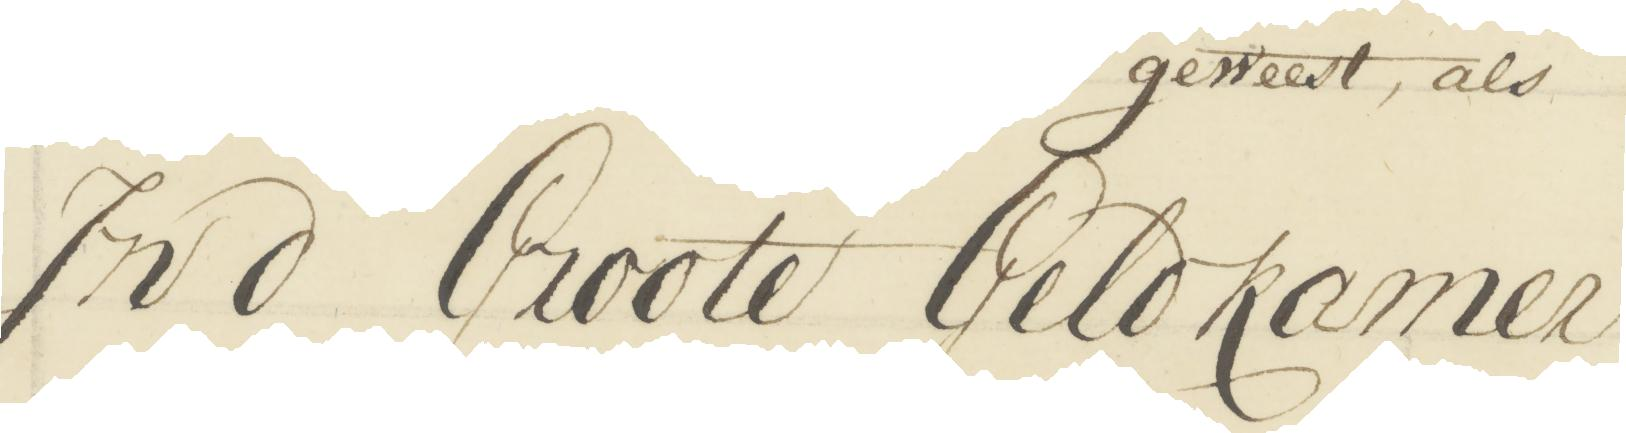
Jn d Groote Geld kamer
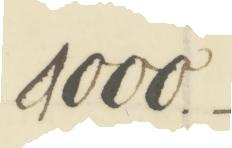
4000.—
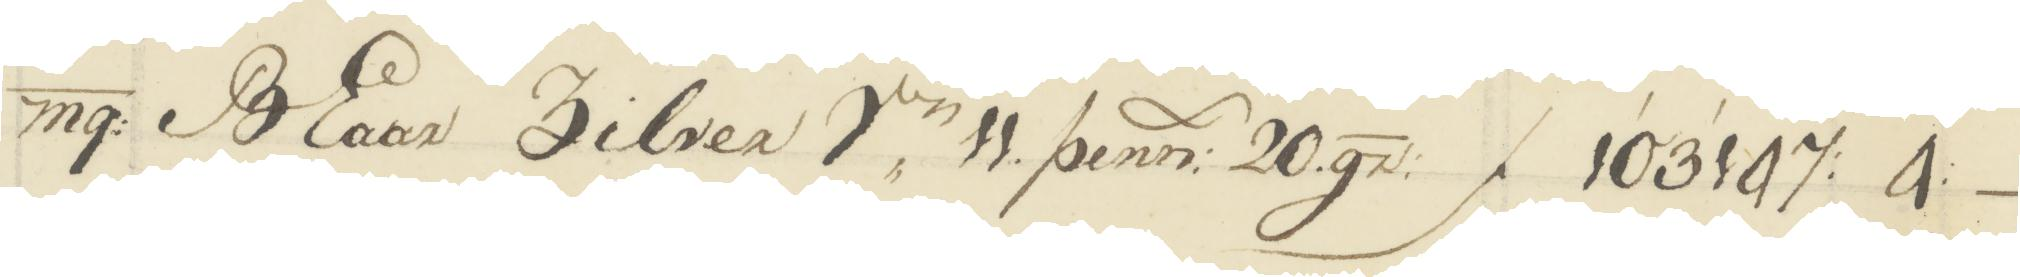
mg: Bhaar Zilver V„n 11. penn: 20. gr: ƒ 1'03'147:4:—
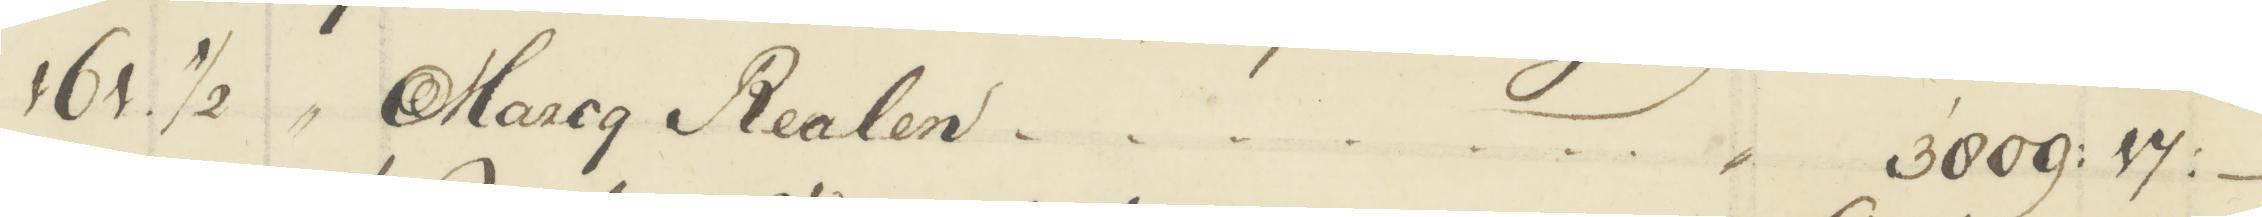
161.½ „ Marcq Realen . . . . . . . „ 3'809:17:–
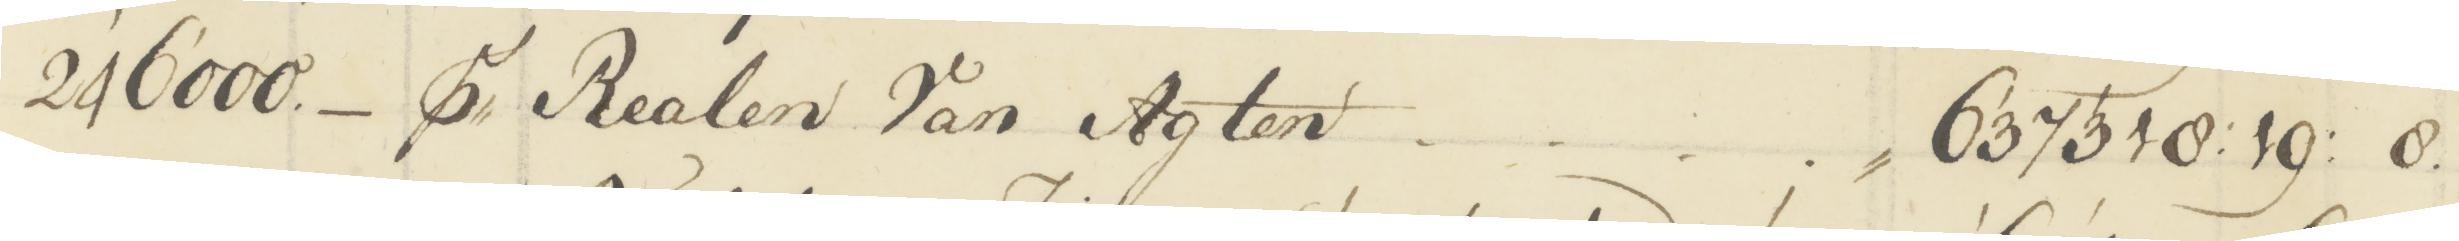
2'46'000. — P„ Realen van Agten . . . . „ 6'37'318:19: 8.
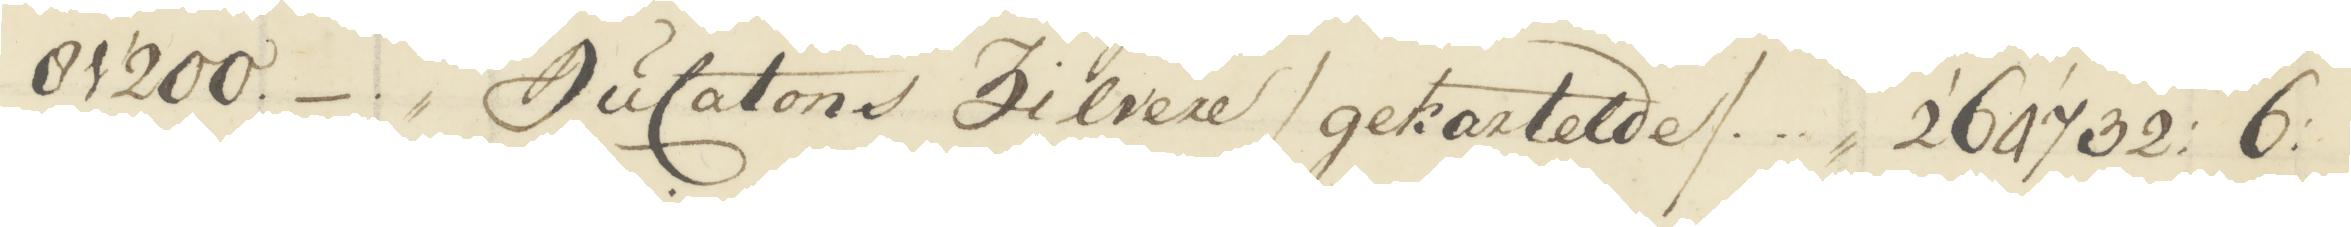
81'200. — . „ Ducatons Zilvere /gekartelde/. .. „ 2'64'732:6:
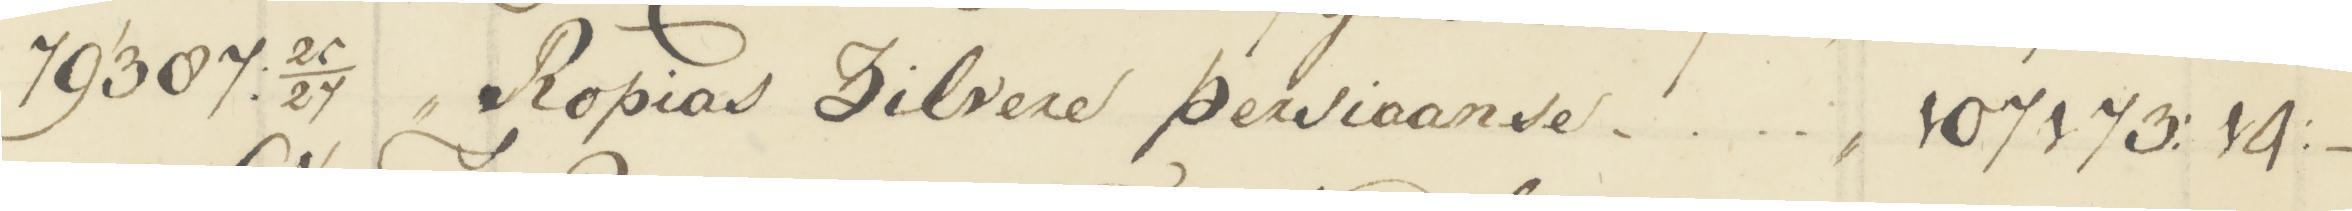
79'387:25/27 „ Ropias Zilvere Persiaanse . . .. „107173:14:—
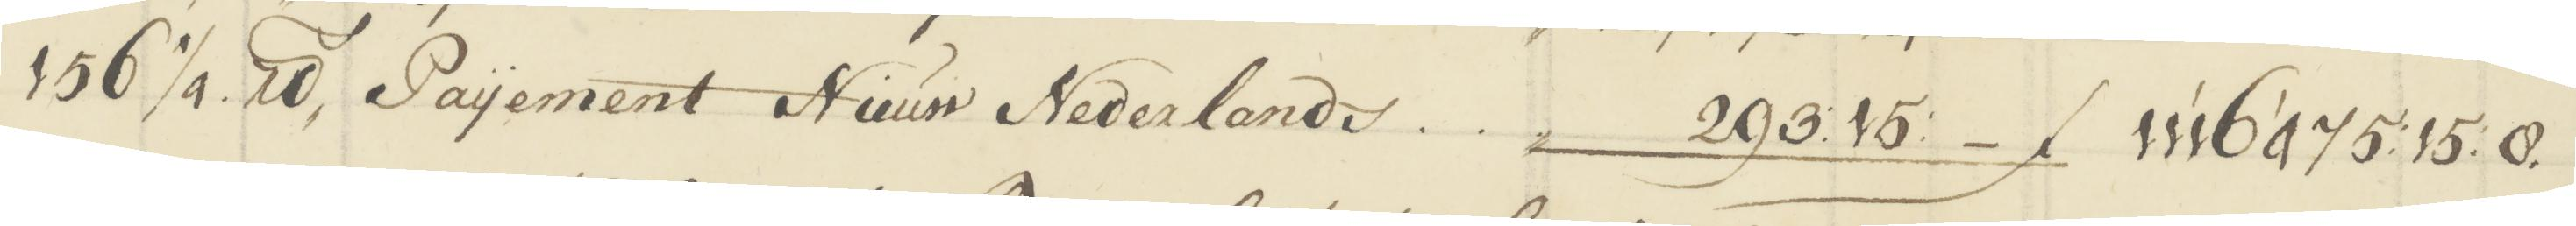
156¼. id„ Paijement Nieuw Nederlands . . „ 293:15: — ƒ 11'16'475:15:8.
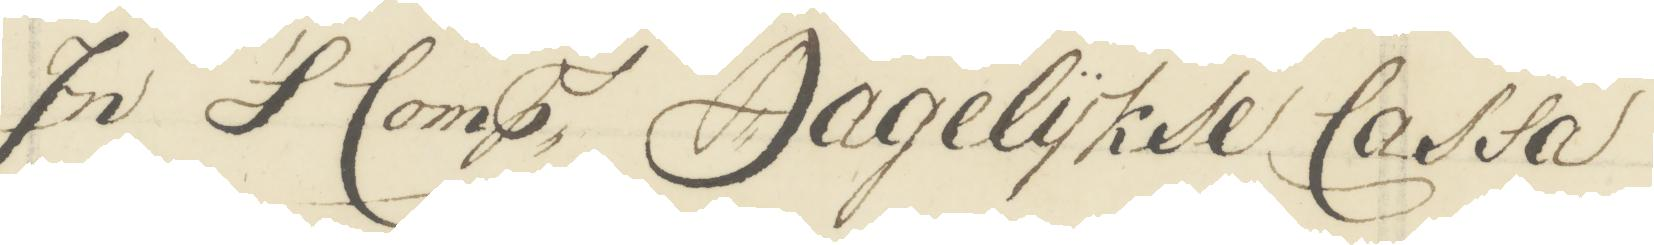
Jn ’s Comp„s Dagelijkse Cassa
